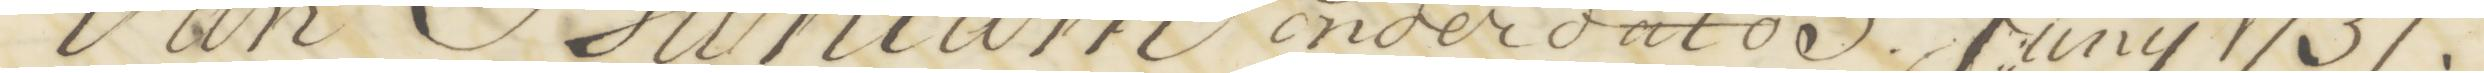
Van Bantam onder dato 3: Junij 1737.
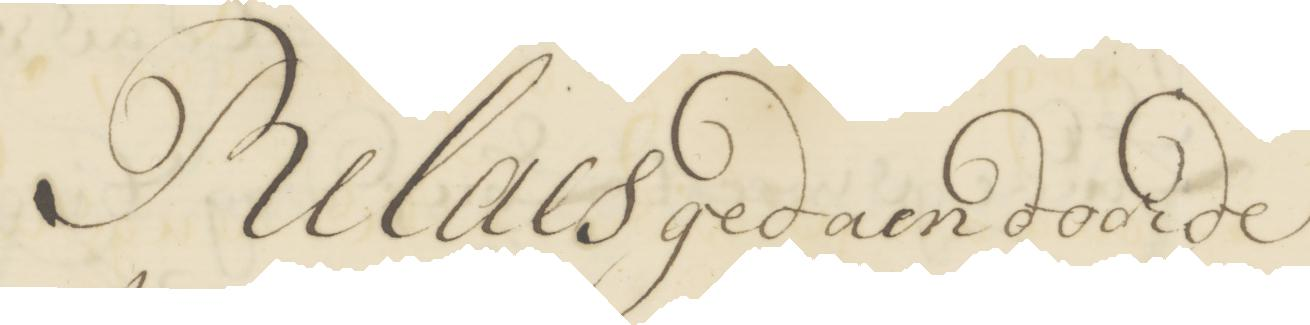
Relaes gedaen door de
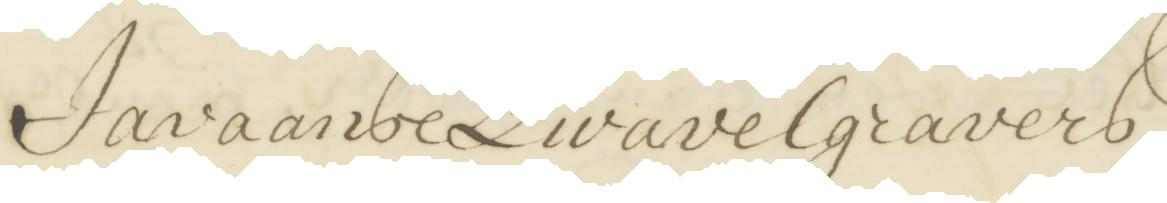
Iavaanse Zwavelgravers
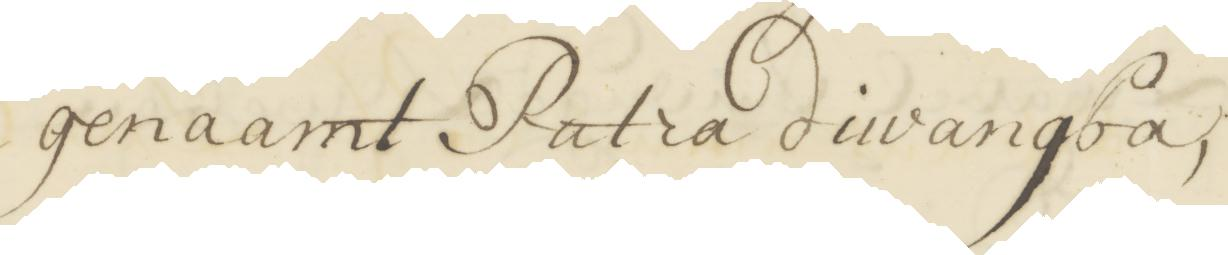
genaamt Patra diwangsa,
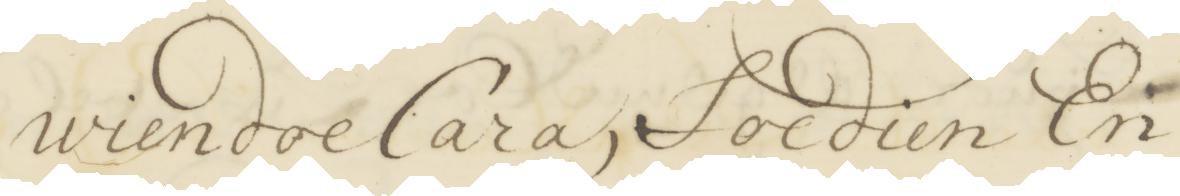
wiendoe Cara, Soedien En
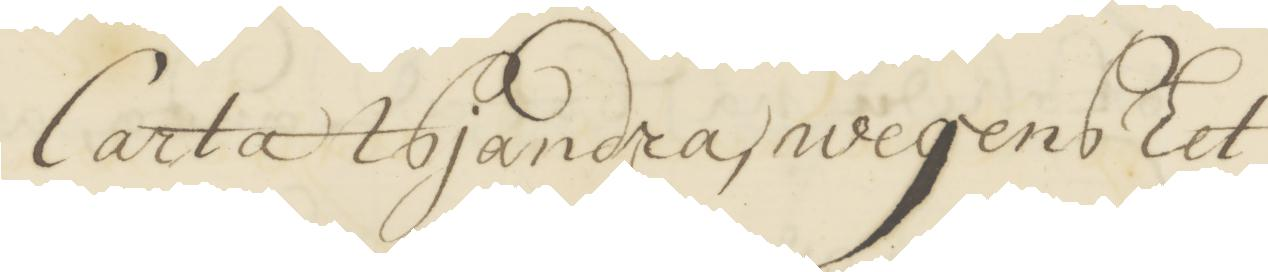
Carta tsjandra, wegens het
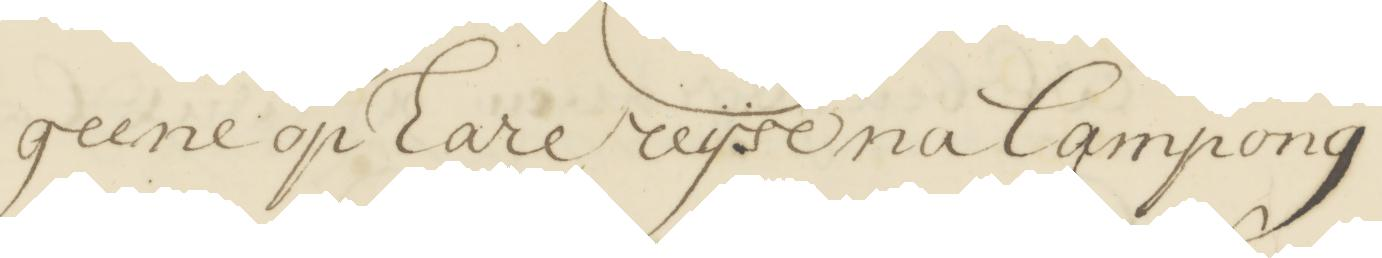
geene op hare reijse na lampong
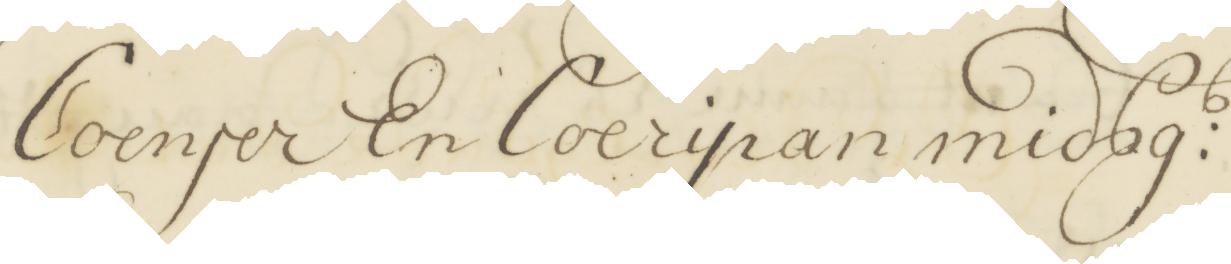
Coenger En Coeripan midsg:s
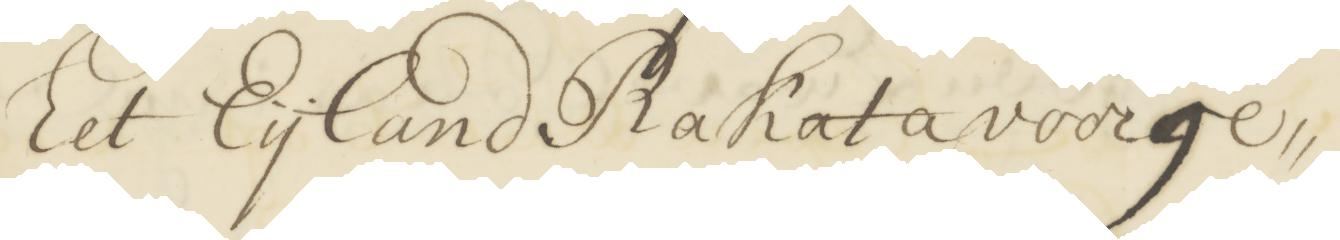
het Eijland Rakata voorge„
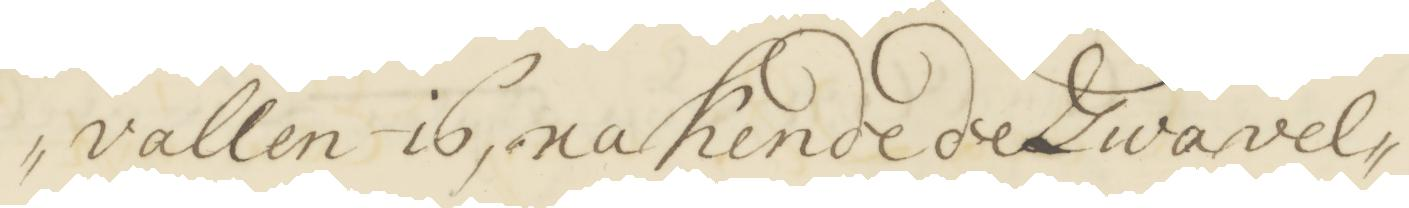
„vallen is, nakende de Zwavel„
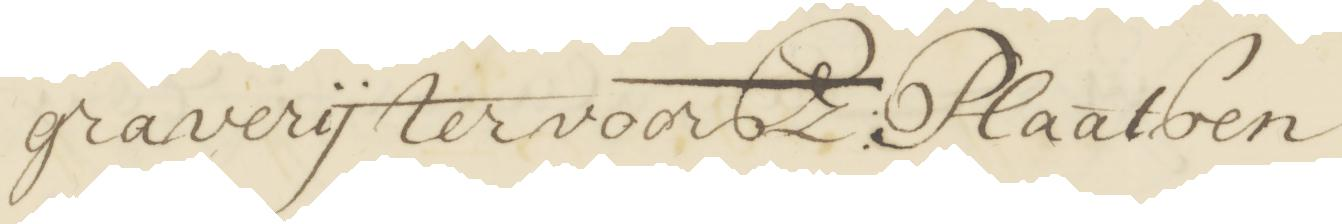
graverij ter voorsz: Plaatsen
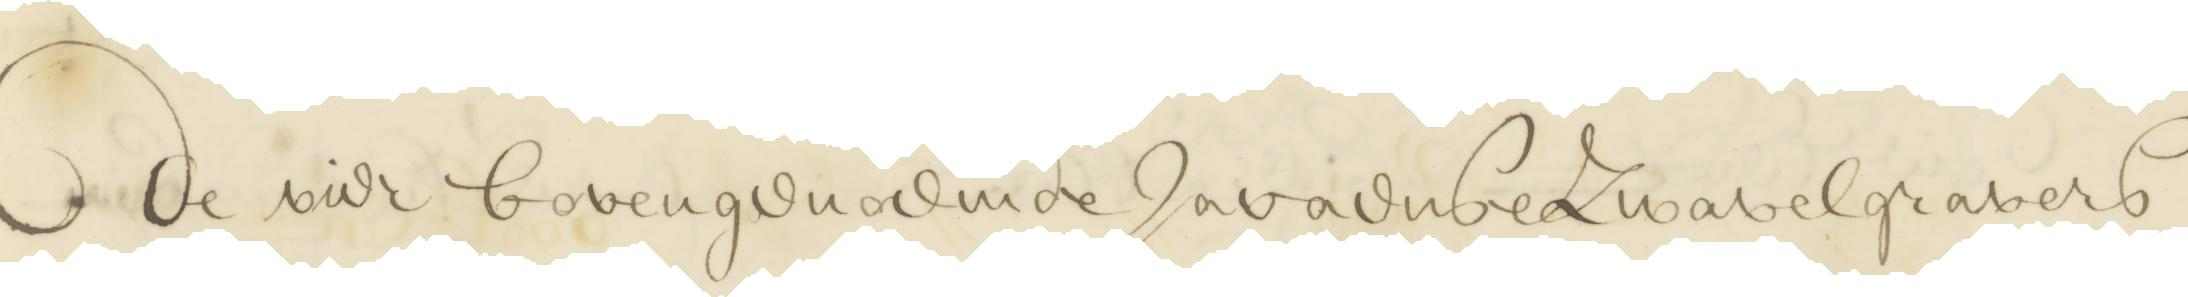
de vier bovengenoemde Javaense Zwavelgravers
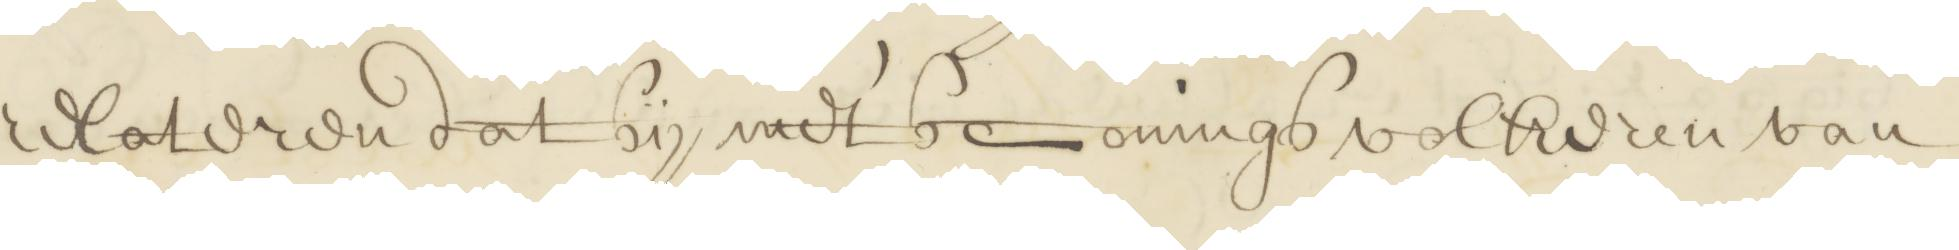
relateren dat sij met 'S conings volkeren van
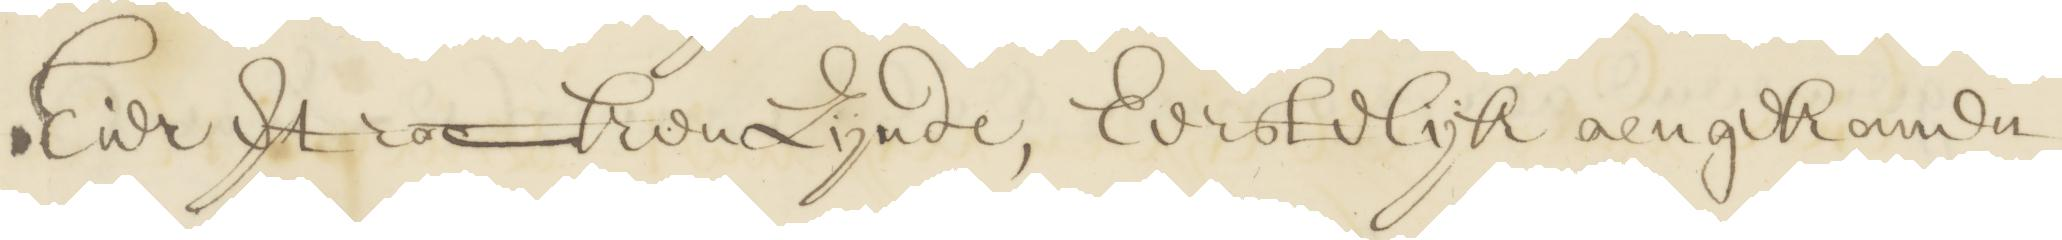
hier vertrocken Zijnde, Eerstelijk aengekomen
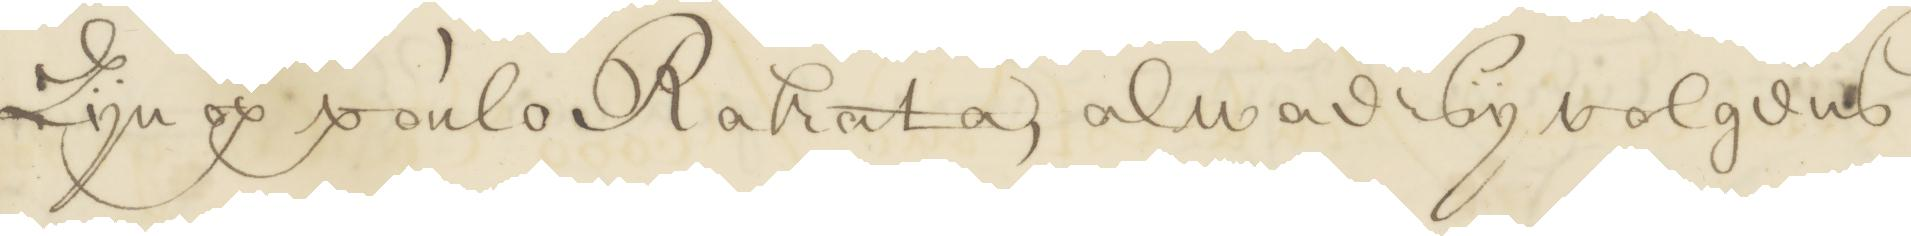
zijn op poulo Rakata, alwaer sij volgens
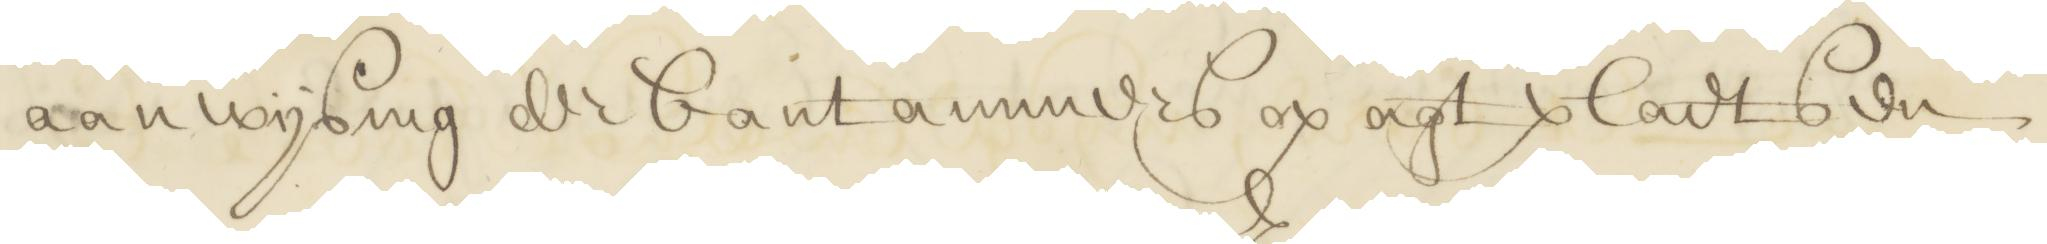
aanwijsing der bantammers op agt plaetsen
